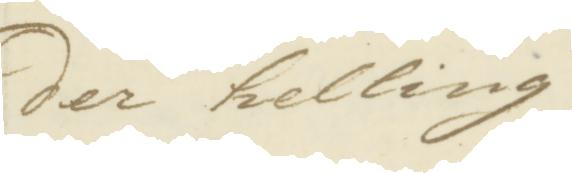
der helling
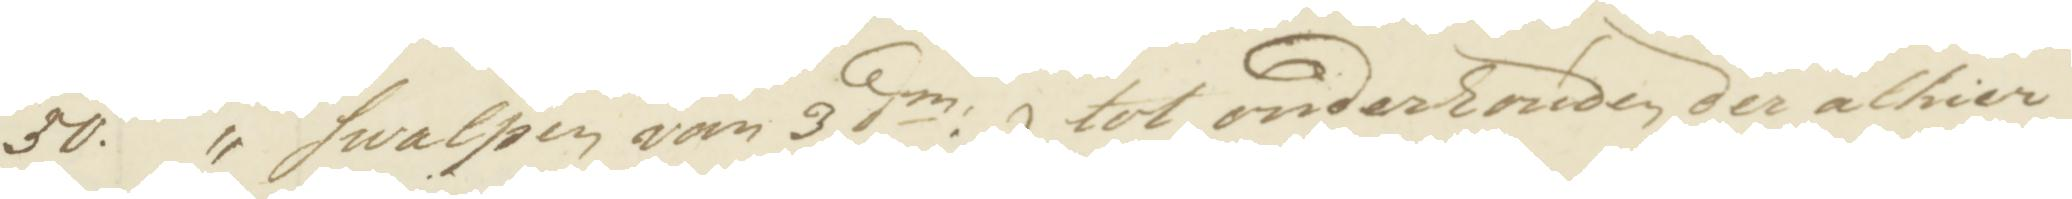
50. „ swalpen van 3 d=m: tot onderhouden der alhier
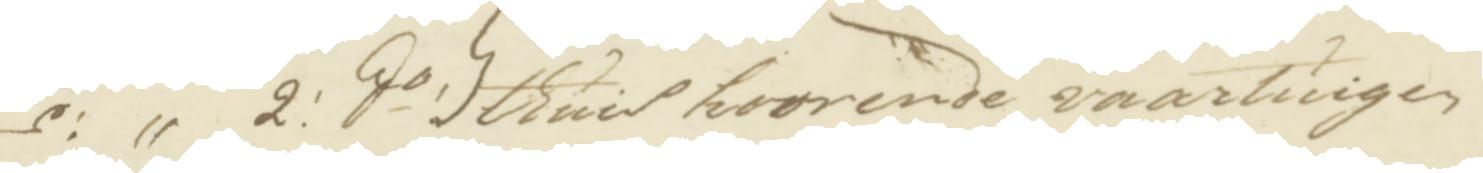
_o: „ 2: d=o thuis hoorende vaartuigen
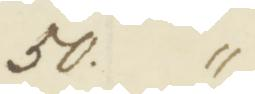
50. „
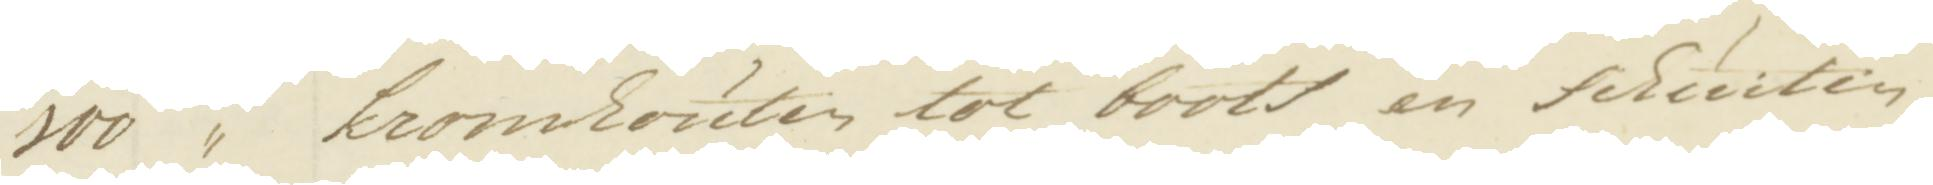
100 „ kromhouten tot boots en schuiten
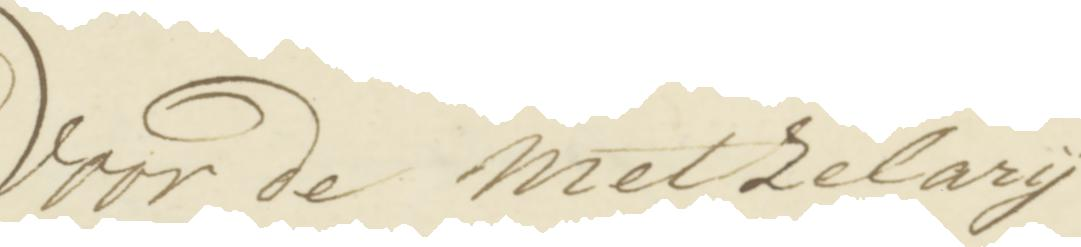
Voor de metzelarij
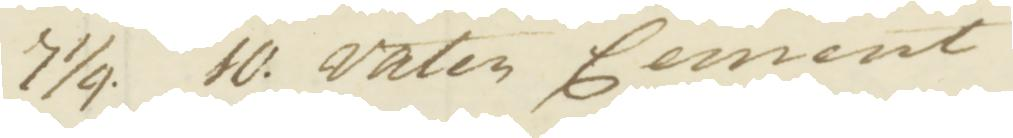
7¼. 10. vaten Cement
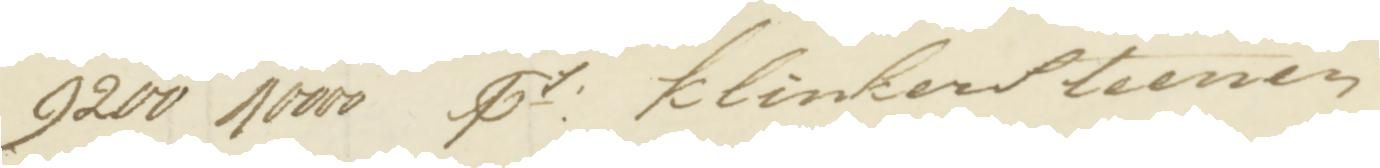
9200 40000 p=s klinkersteenen
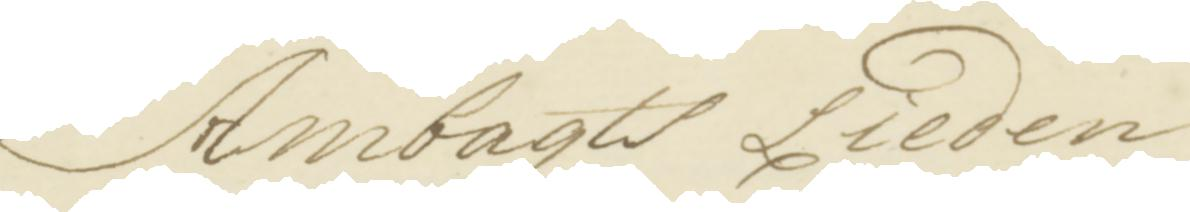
Ambagts Lieden
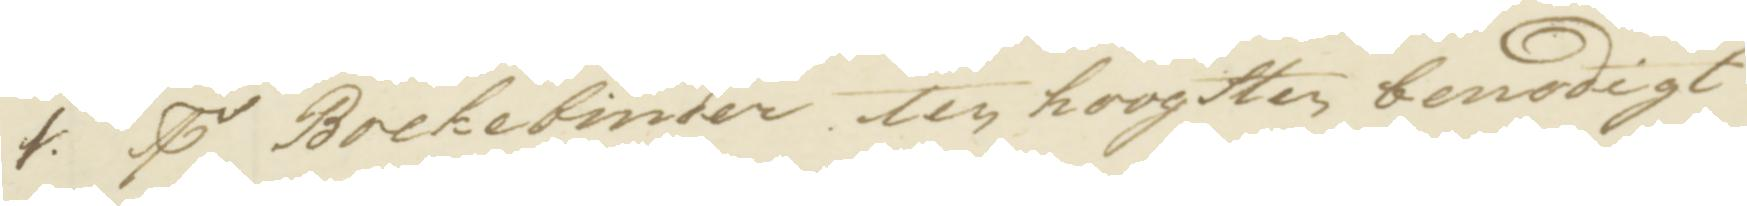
1: ps Boekebinder ten hoogsten benodigt
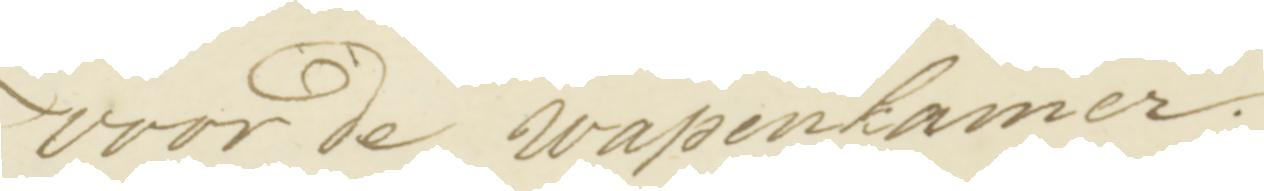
voor de wapenkamer.
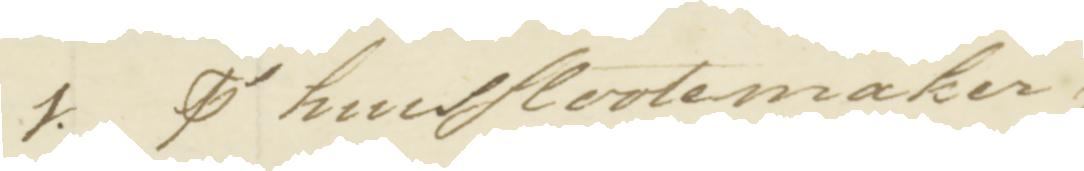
1: p.s huisslootemaker.
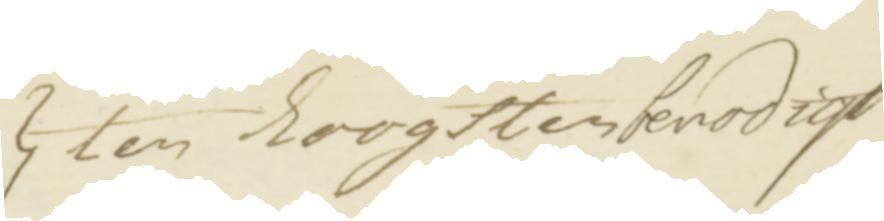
ten hoogsten benodigt
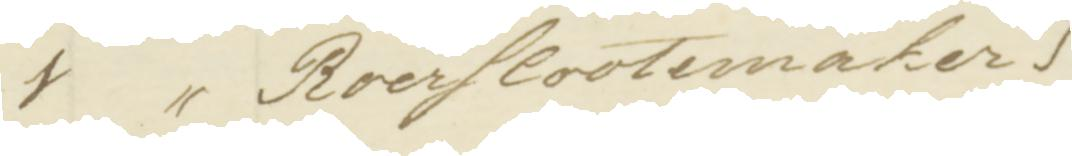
1 „ Roerslootemakers
